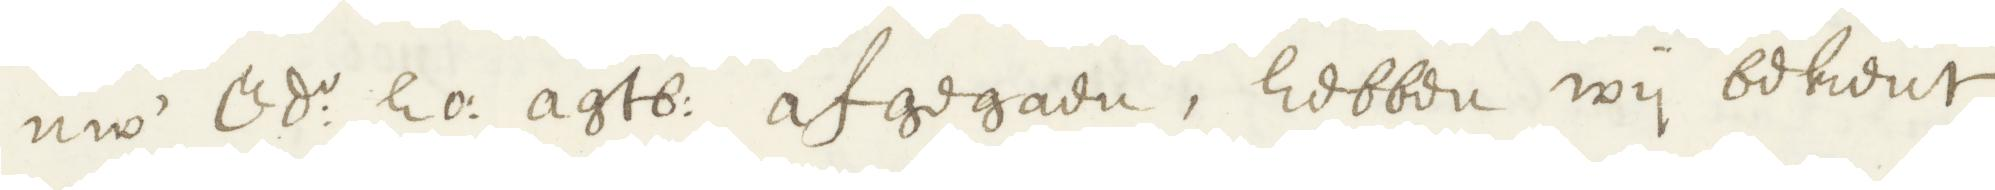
uw' Ed:e ho: agtb: afgegaen, hebben wij bekent
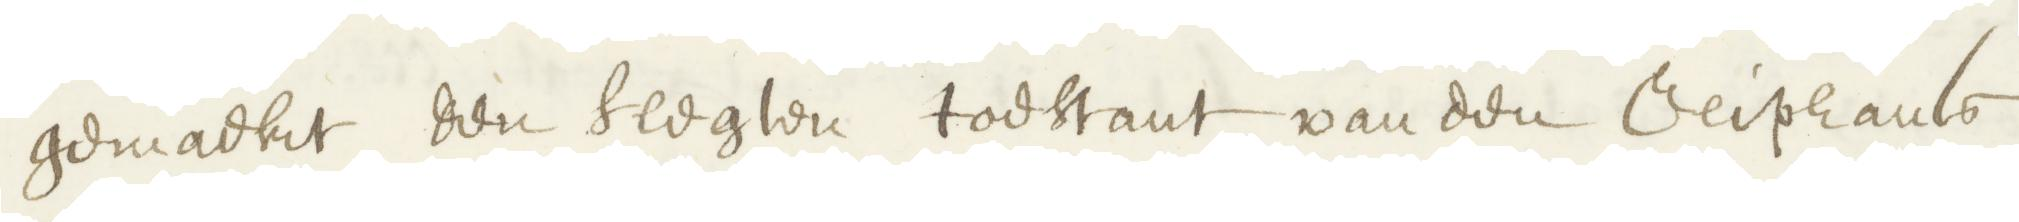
gemaekt den slegten toestant van den Eliphants
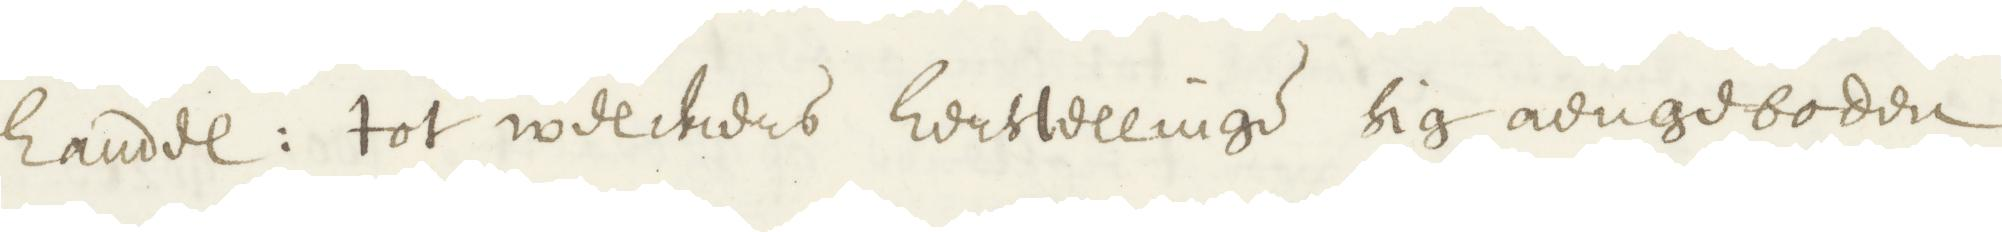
handel: tot welckers herstellinge sig aengeboden
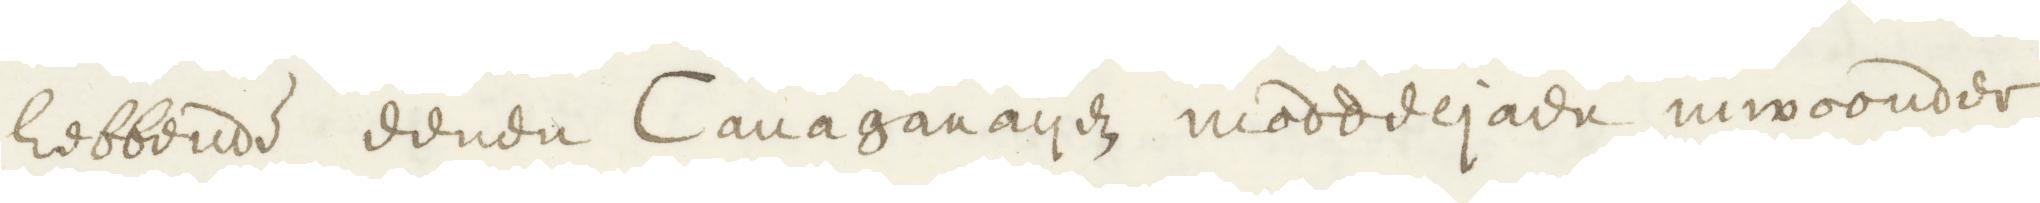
hebbende eenen Canagaraijen moddeljaer inwoonder
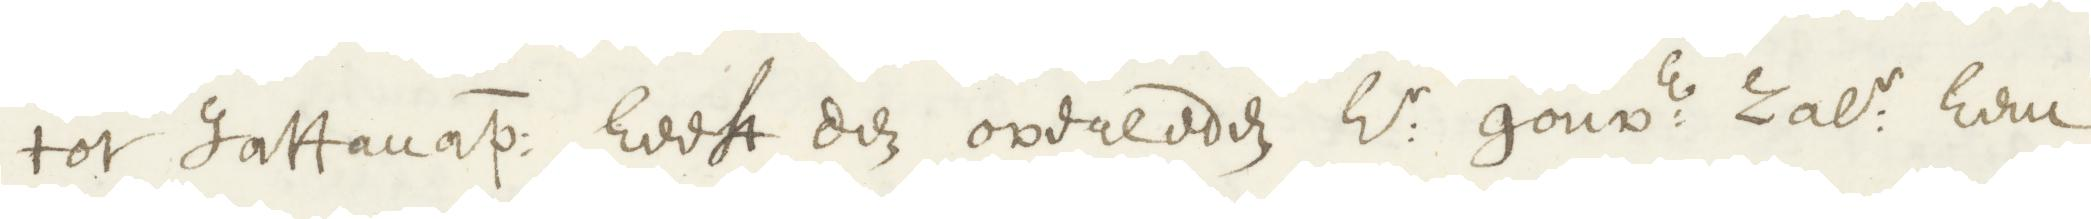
tot Jaffanap: heeft den overleden h:r gouv:' zal:r hem
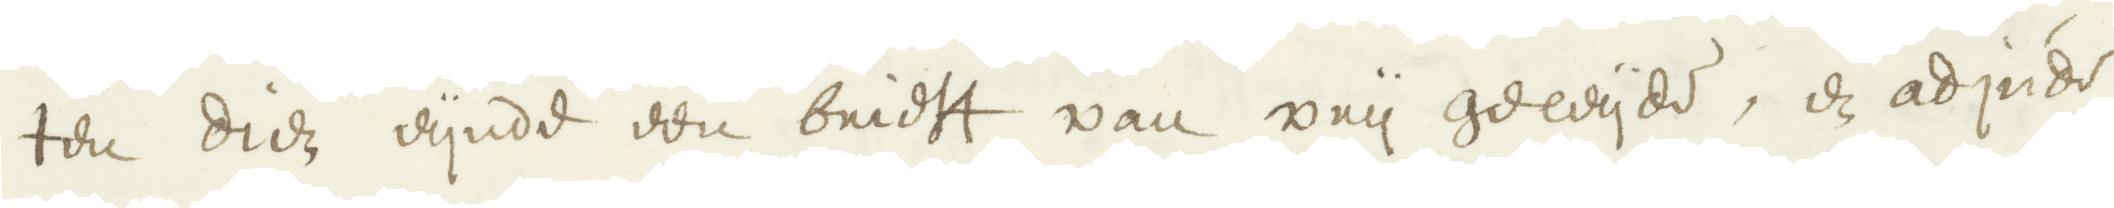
ten dien eijnde een brieff van vrij geleijde, en adjude
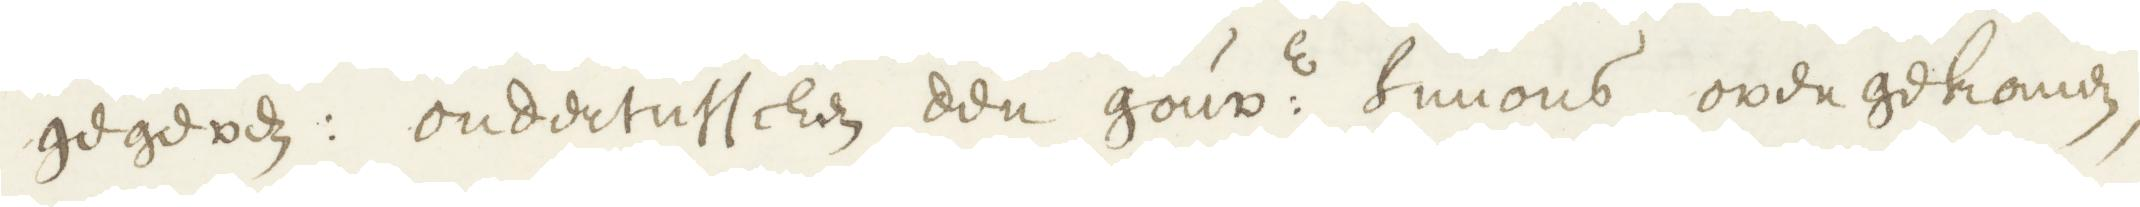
gegeven: ondertusschen den gouv:e simons overgekomen,
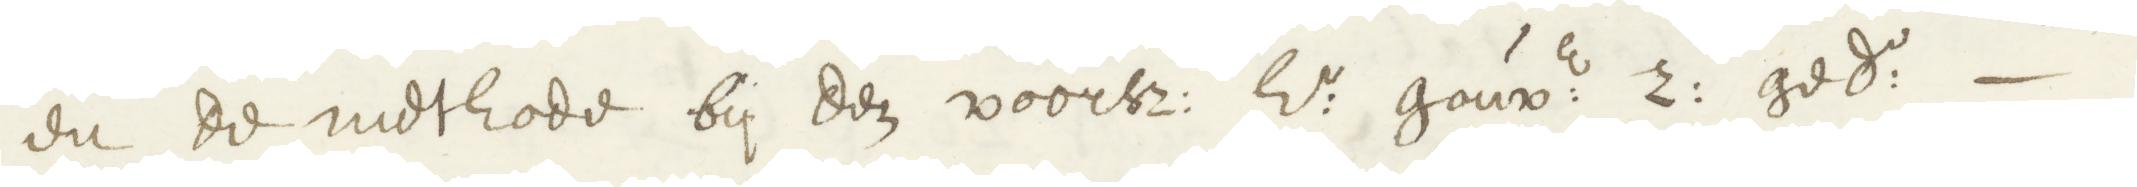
en de methode bij den voorsz: h:r gouv:' z: ged: —
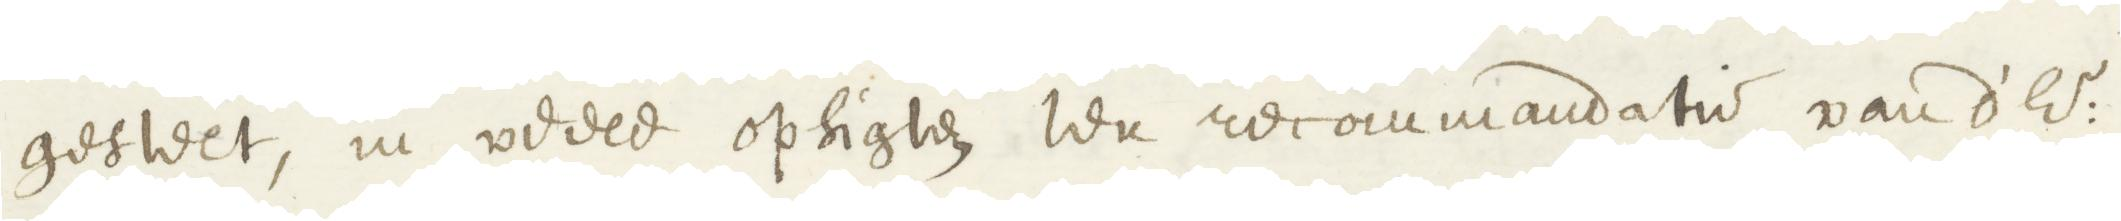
gestelt, in veele opsigten ter recommandatie van d’ h:r
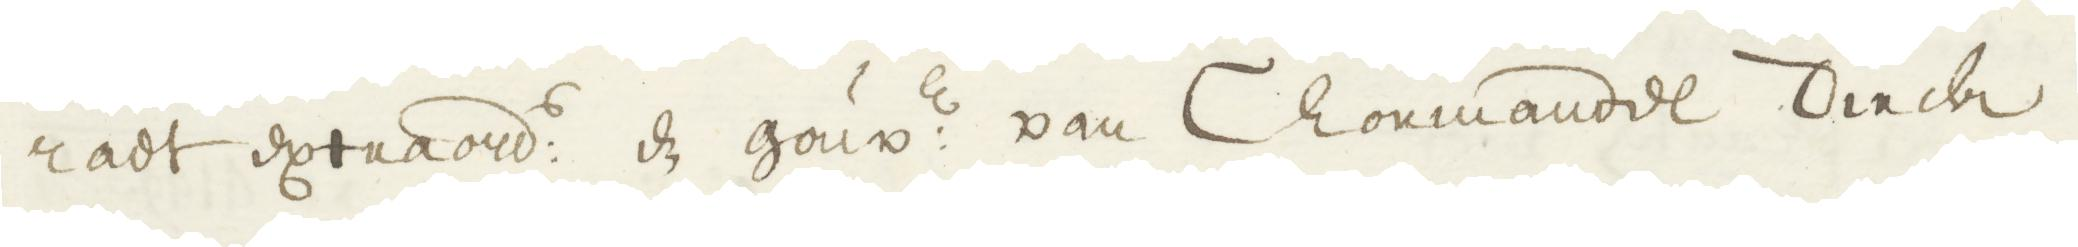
raet extraord:s en gouv:' van Chormandel dirck
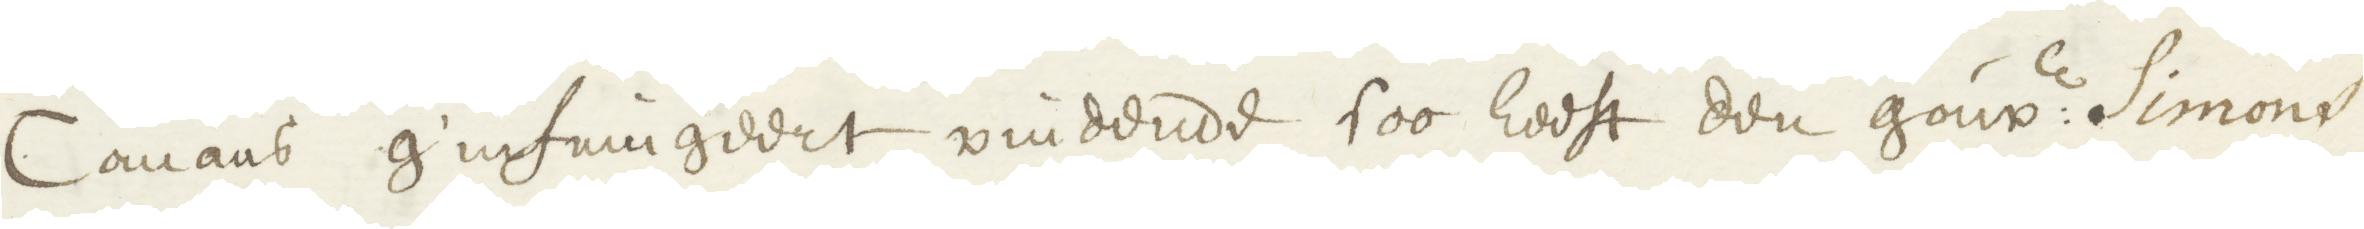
Comans g’infringeert vindende soo heeft den gouv:' Simons
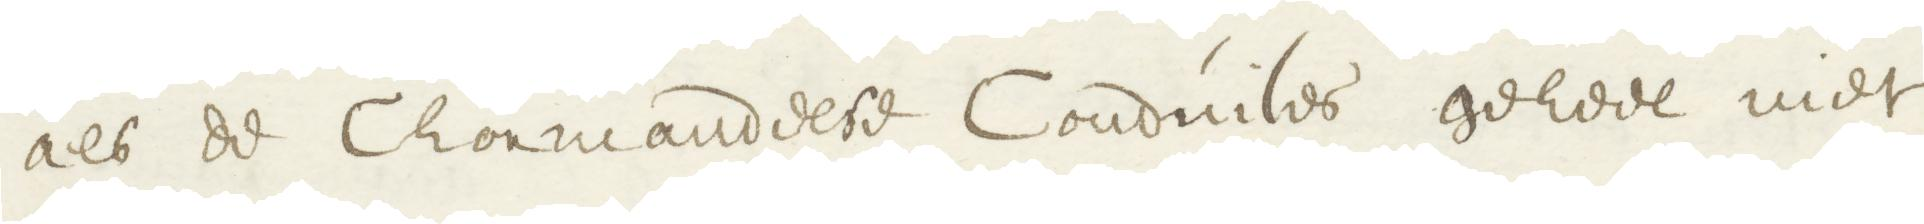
als de Chormandelse Conduites geheel niet
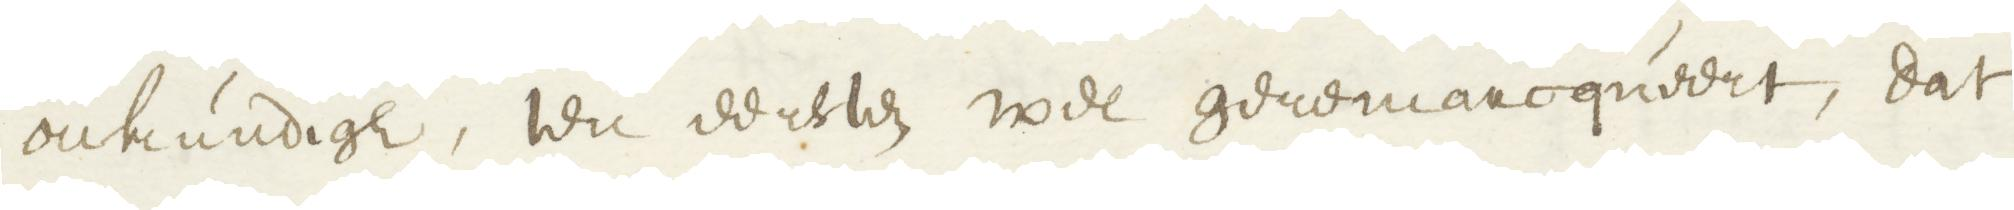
onkundigh, ten eersten wel geremarcqueert, dat
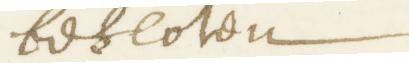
besloten
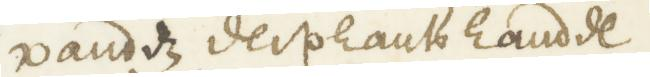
vanden eliphants handel
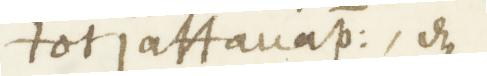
tot jaffanap:, en
